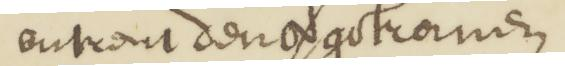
ontrent den overgekomen
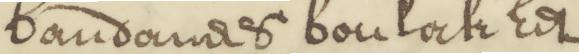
bandanees bonlak het
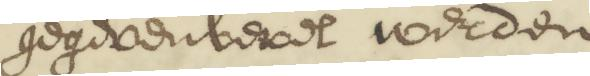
gegeven bevel werden
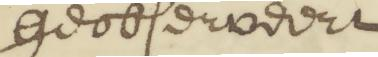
geobserveert
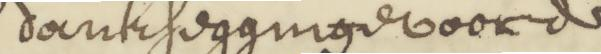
danksegginge voor de
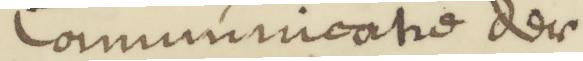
Communicatie der
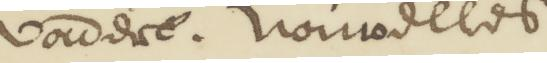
vaderl. nouwelles
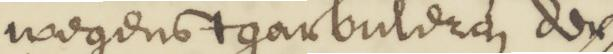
wegens 't garbuleren der
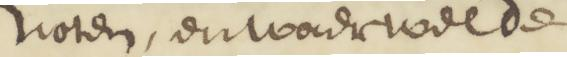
noten, en waer wel de
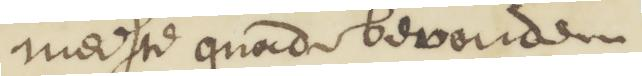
meeste quade bevonden
